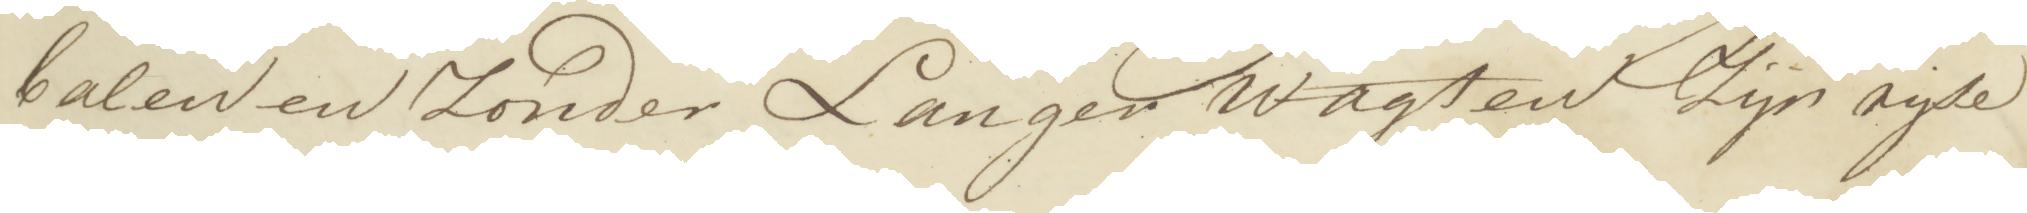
balen en zonder Langer wagten zijn rijse
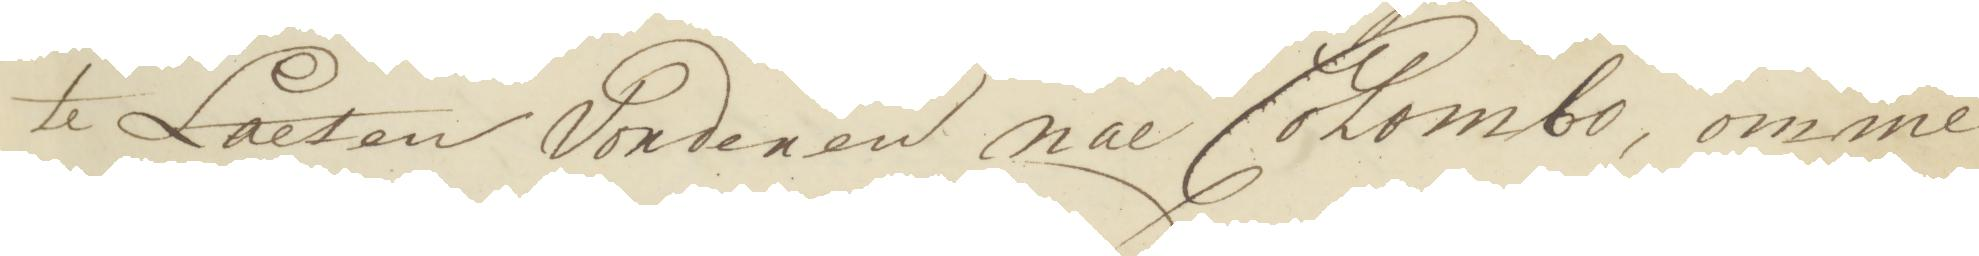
te Laeten Vorderen nae Colombo, omme
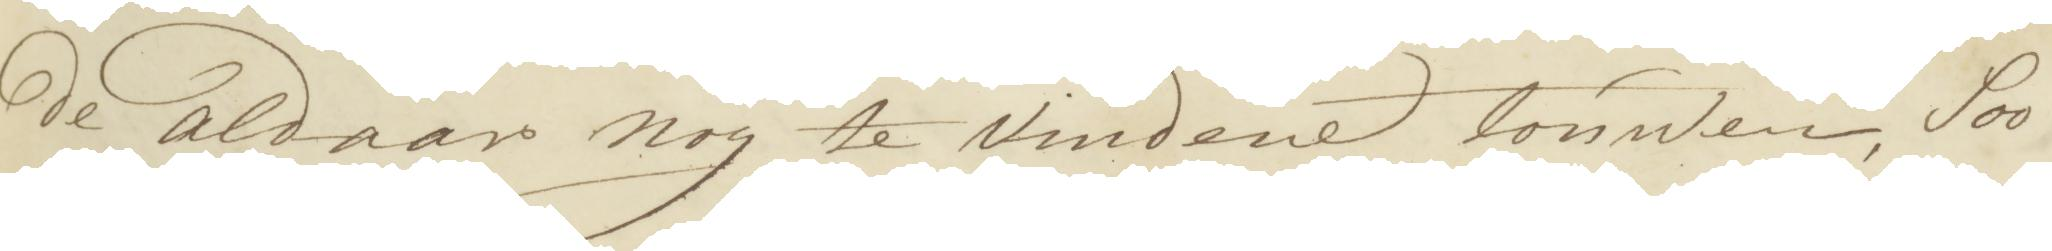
de aldaar nog te vindene touwen, soo
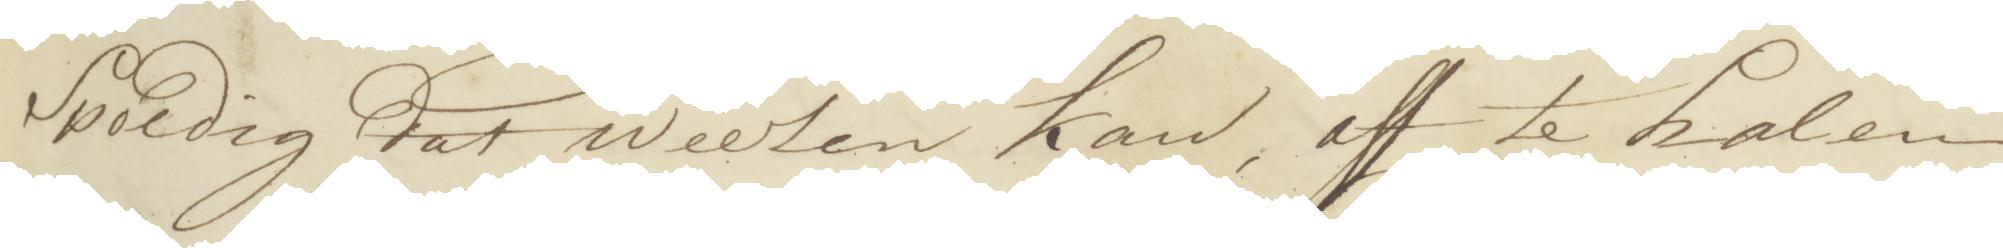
spoedig dat weeten kan, aff te halen
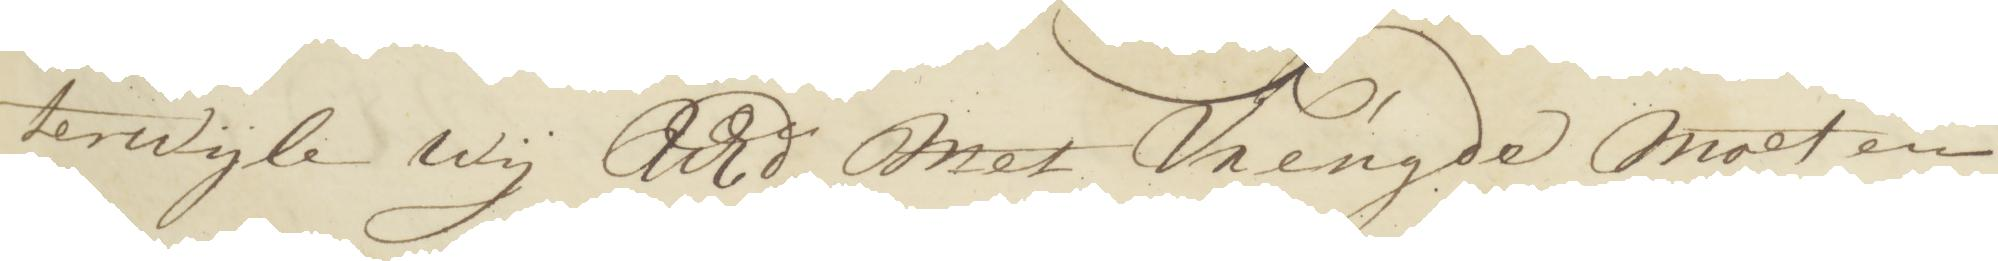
terwijle Wij UEd Met vreugde Moeten
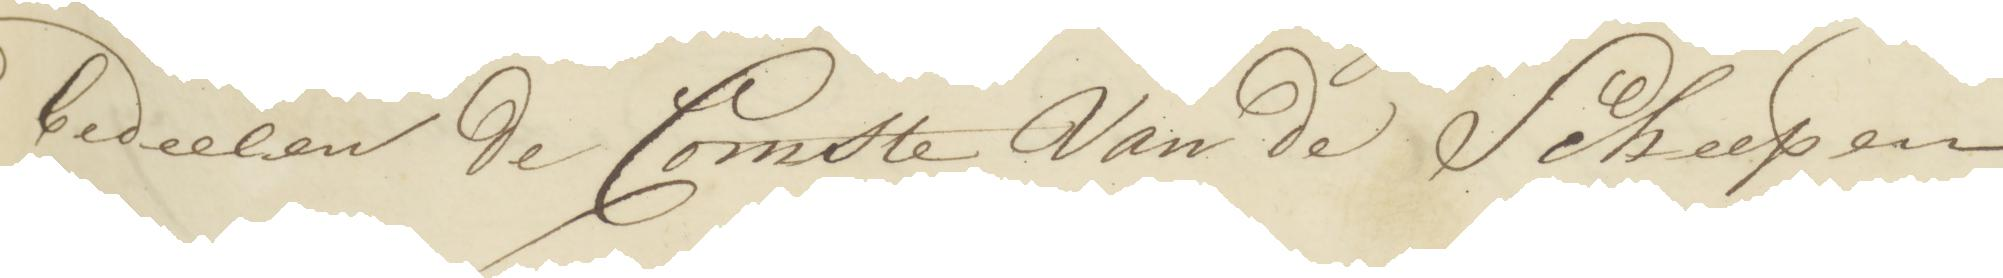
bedeelen de Comste Van de scheepen
